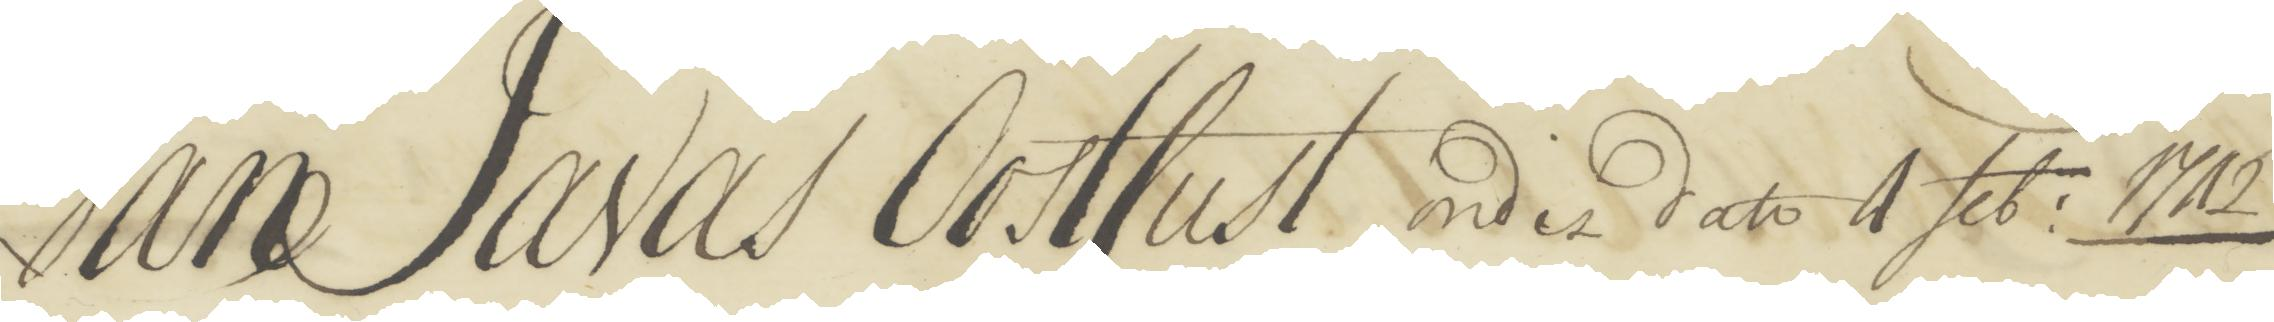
Van Javas Oost Cust onder dato 4 feb: 1742
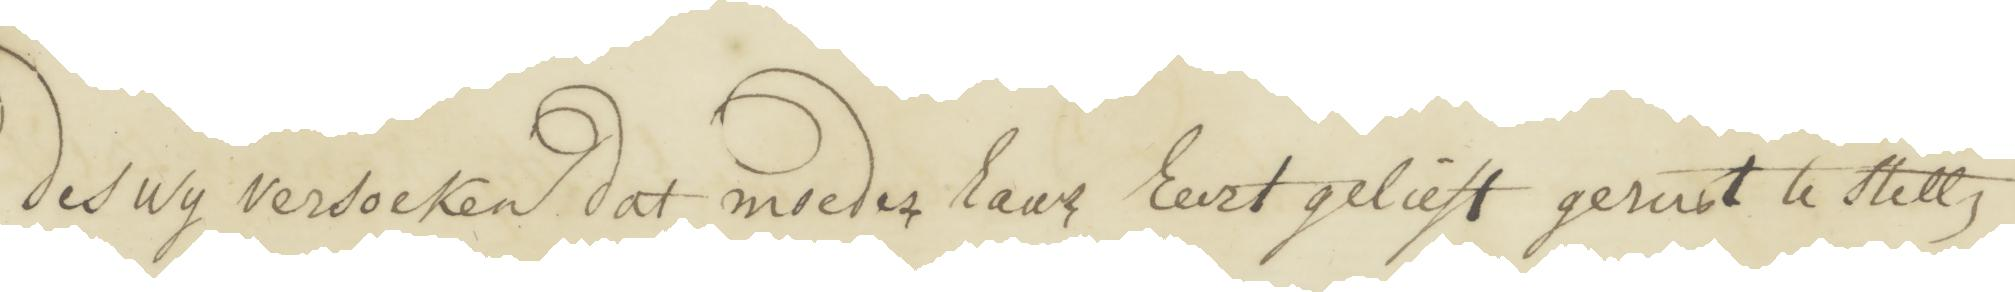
des wy versoeken dat moeder haar heert gelieft gerust te stellen
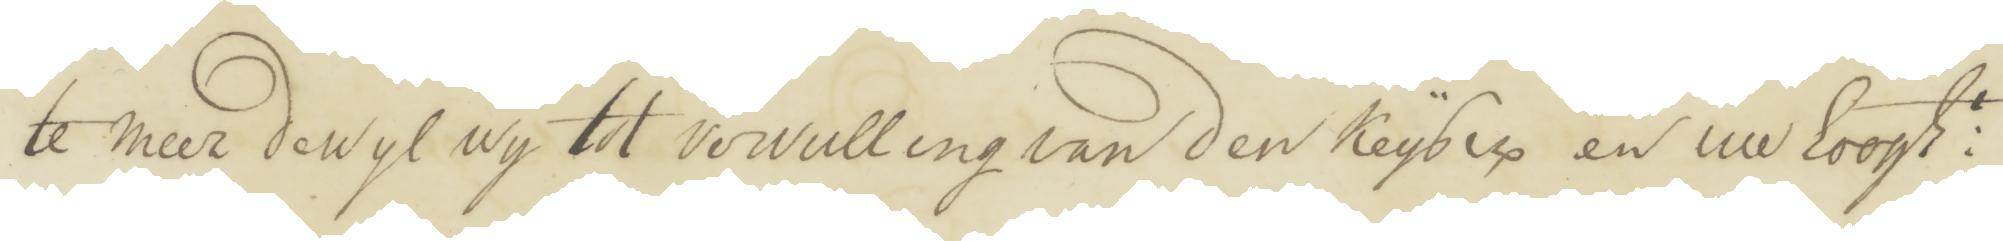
te meer dewyl wy tot vervulling van den keijser en uw hoogh:t
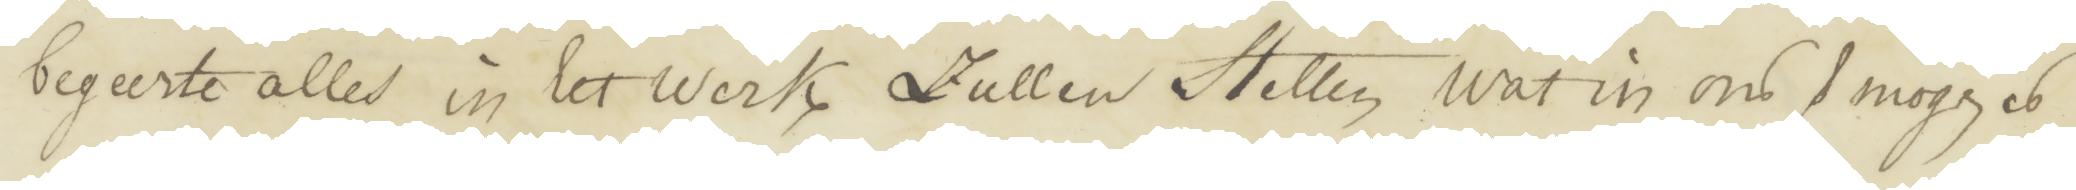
begeerte alles in het werk zullen stellen wat in ons vermogen is
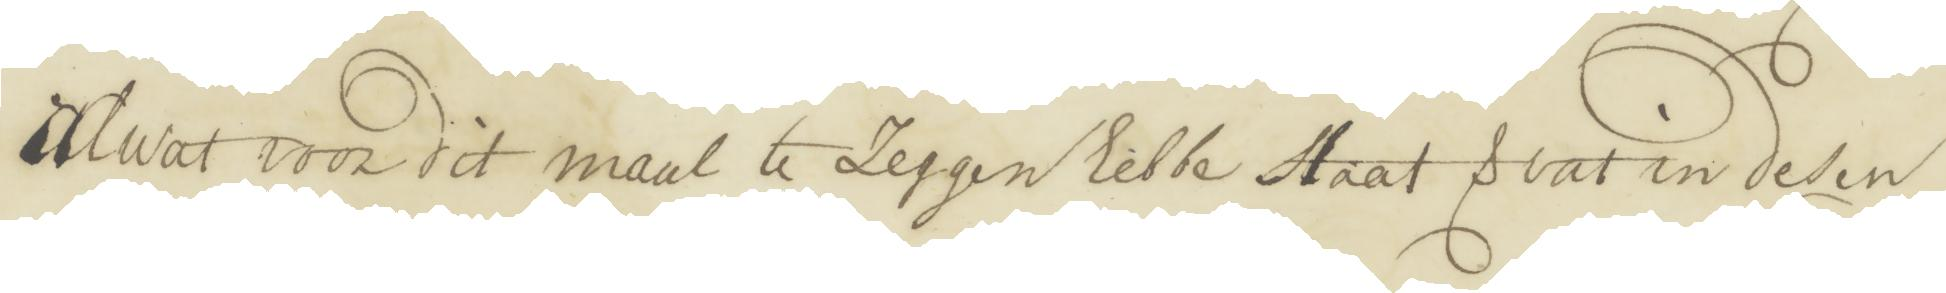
alwat voor dit maal te zeggen hebbe staat vervat in desen
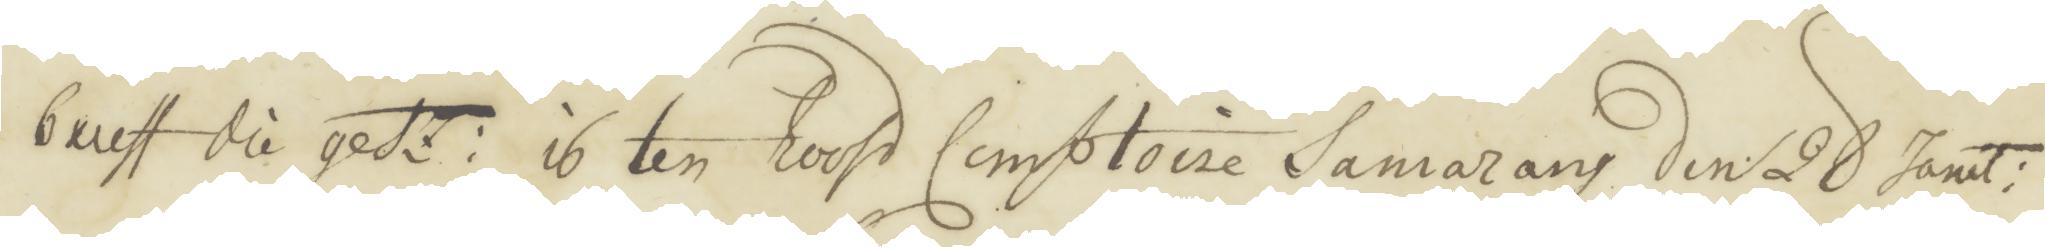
brieff die gesz: is ten hoofd Comptoire Samarang den 28 Jann:
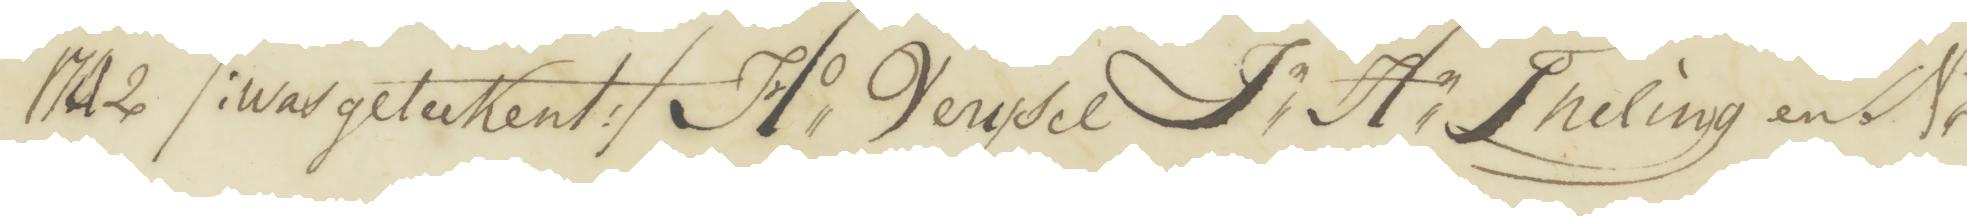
1742 /:was geteekent:/ H„o Verijsel J„n H„n Theling en NO
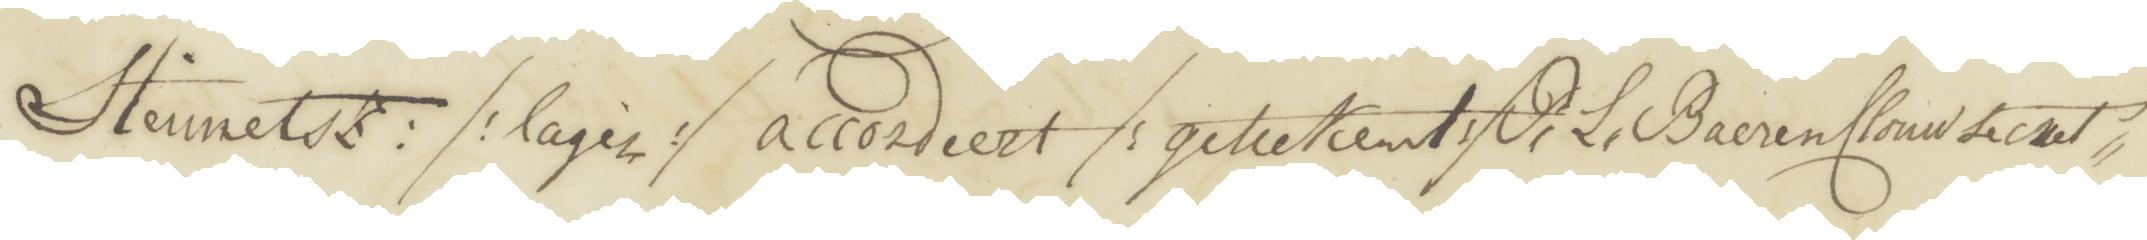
Heinretsz: /:lager:/ accordeert /:geteekent:/ P„ L„ BaerenClouw secret„s
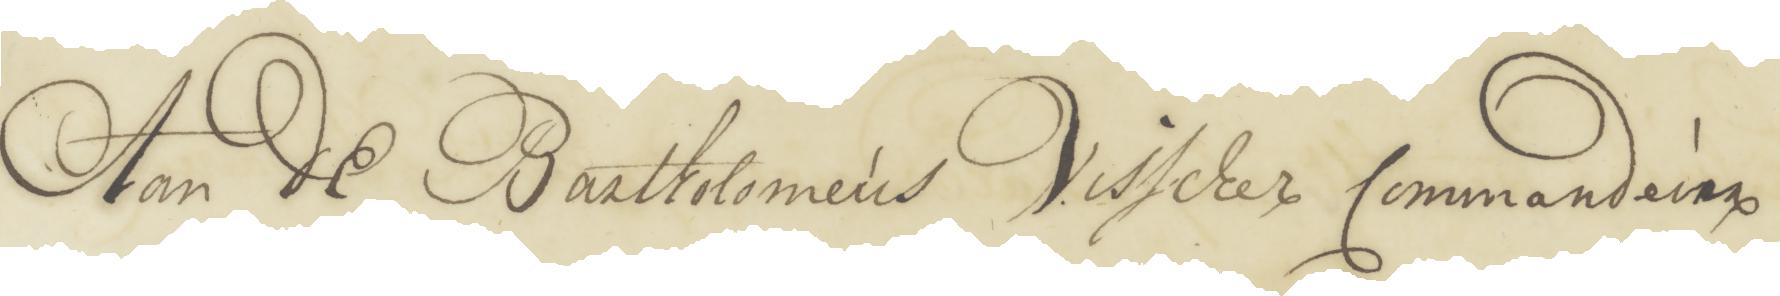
Aan dE Bartholomeus Visscher Commandeur
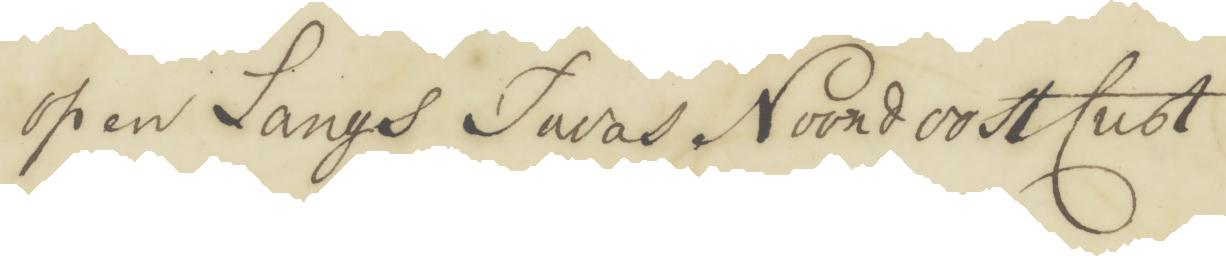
op en Langs Javas Noordoost Cust
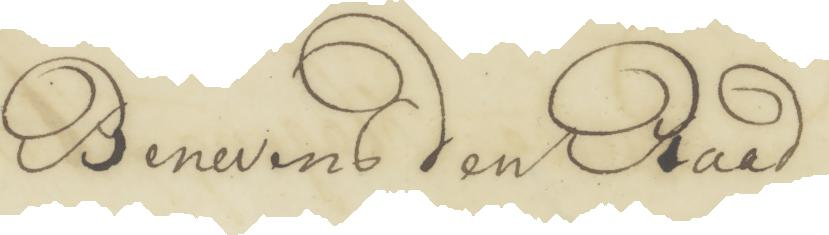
Benevens den Raad
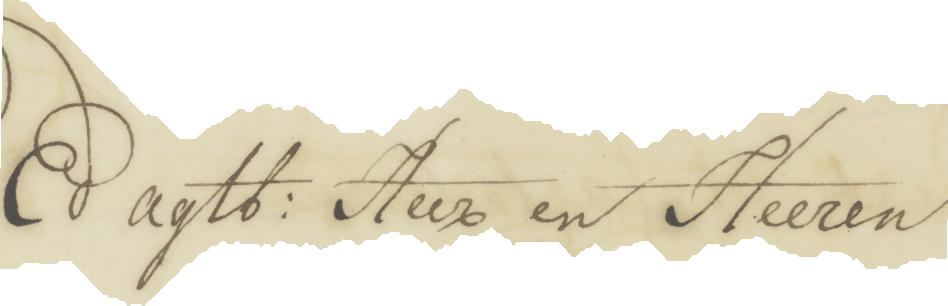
Ed agtb: Heer en Heeren
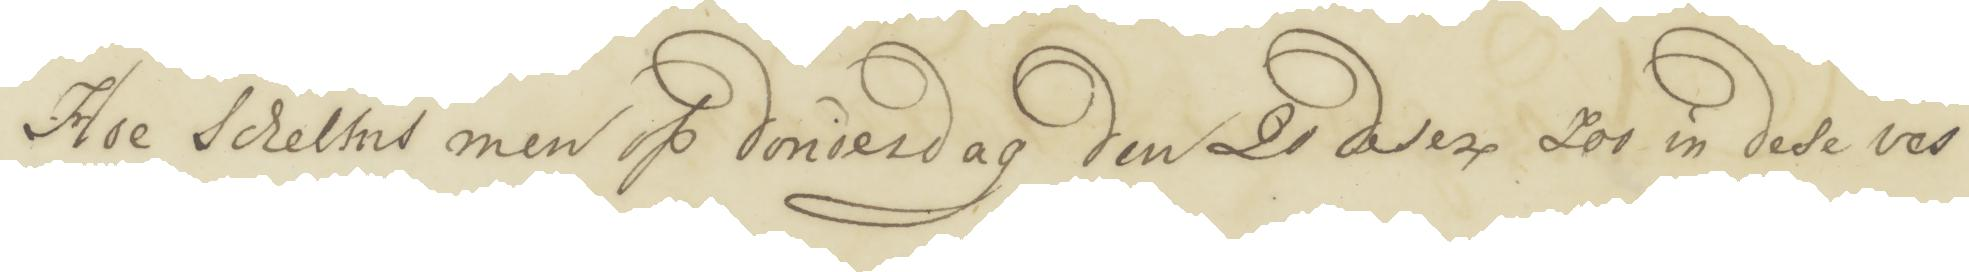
Hoe schelms men op donderdag den 20 deser zoo in dese ves
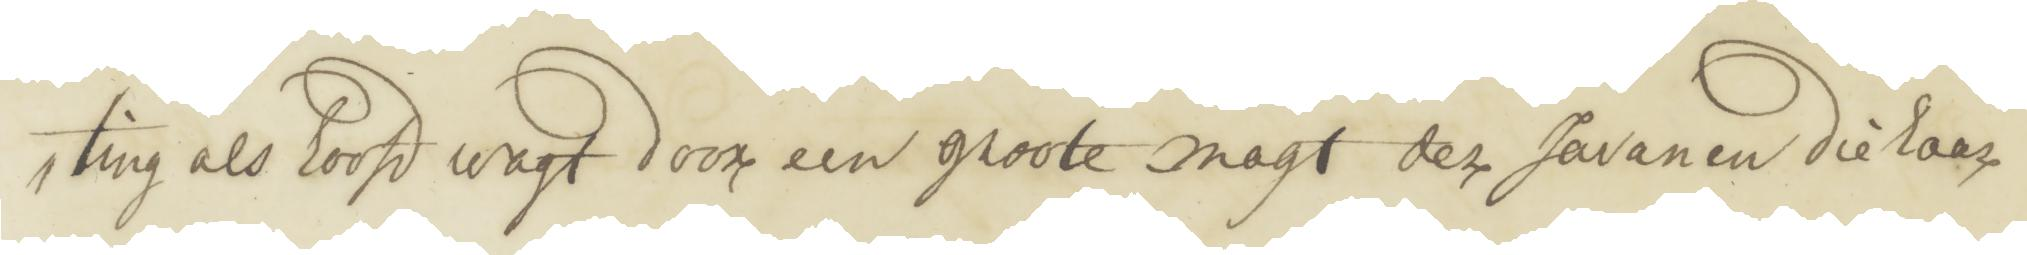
„ting als hoofd wagt door een groote magt der Javanen die haar
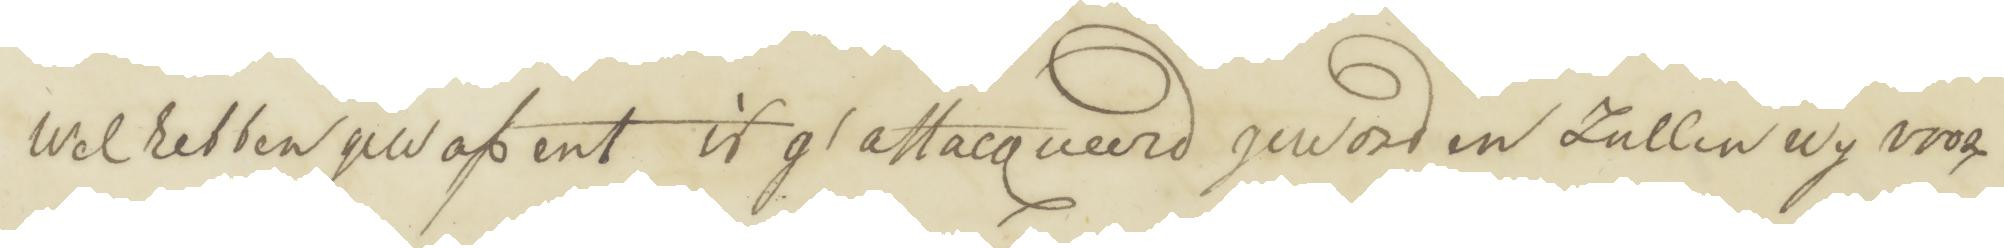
wel hebben gewapent is g’ attacqueerd geworden zullen wy voor
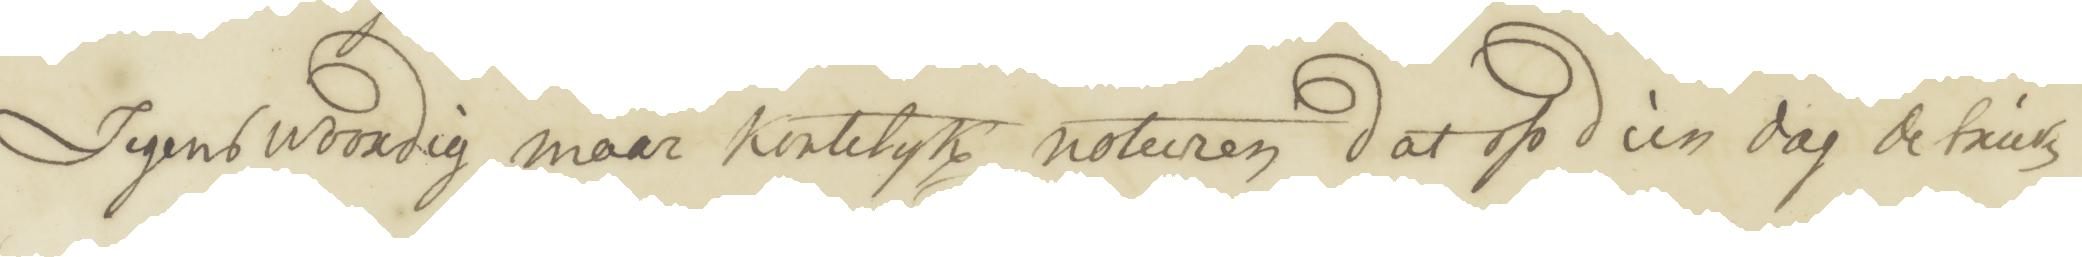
Jegens woordig maar kortelyk noteeren dat op dien dag de scuten
